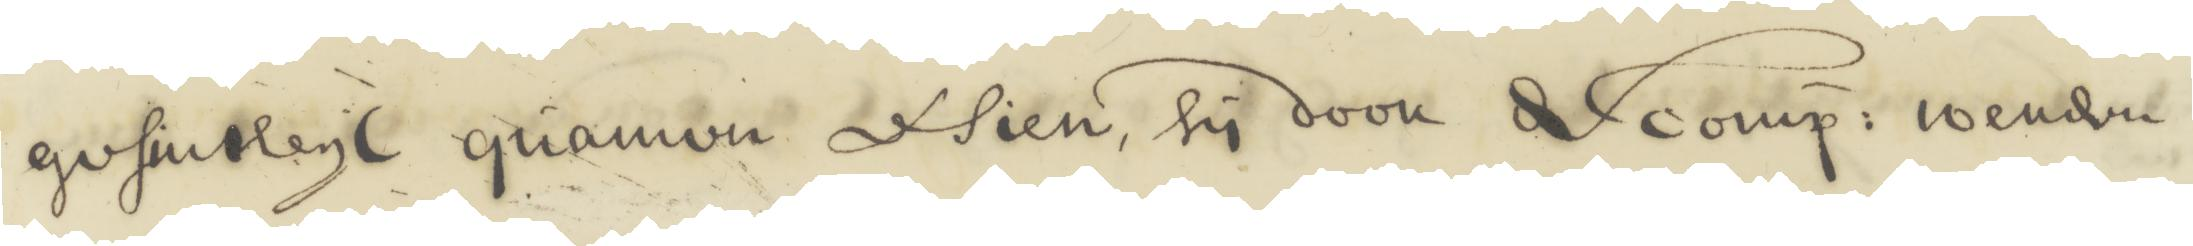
gesintheijt quamen te sien, sij door dE comp: werden
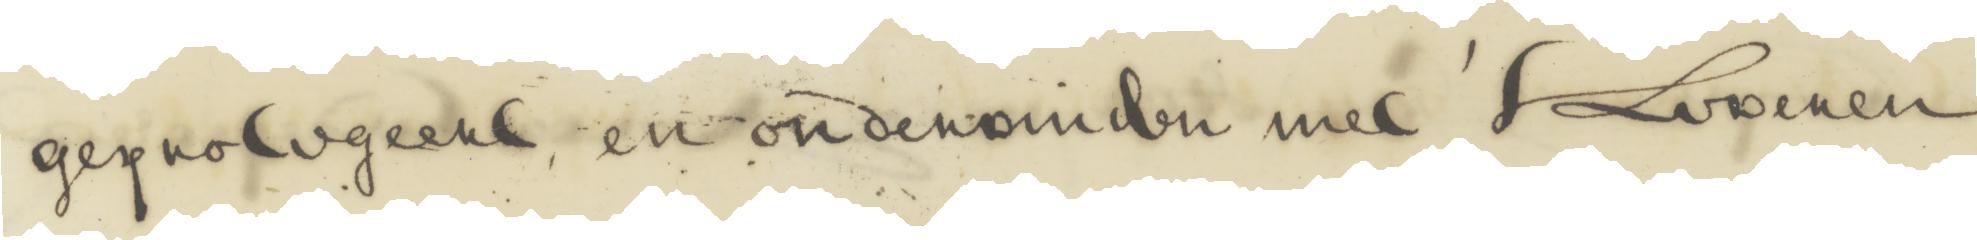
geprotegeert, en ondervinden met ’t Leveren
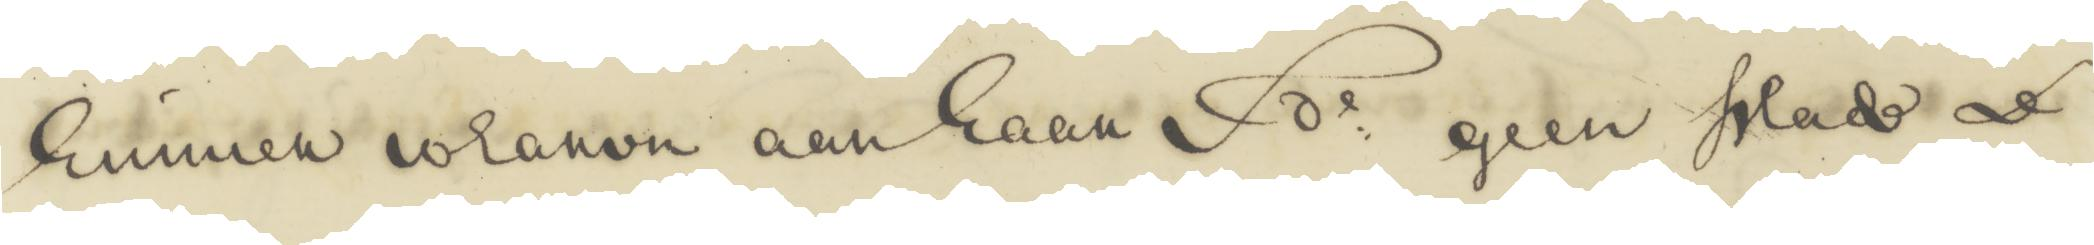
hunner wharen aan haar Ed:e geen schade te
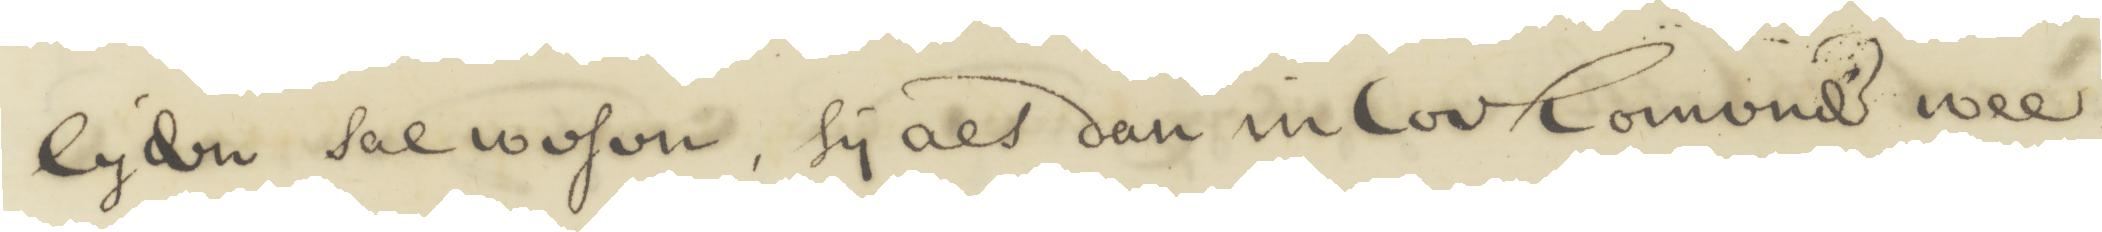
lijden sal wesen, sij als dan in toekomende wel
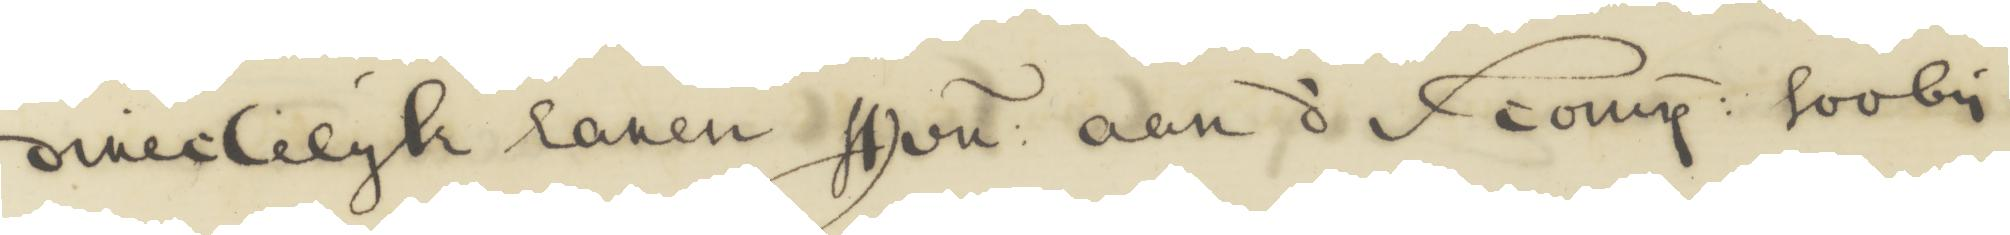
directelijk haren pper: aan d' Ecomp: soo bij
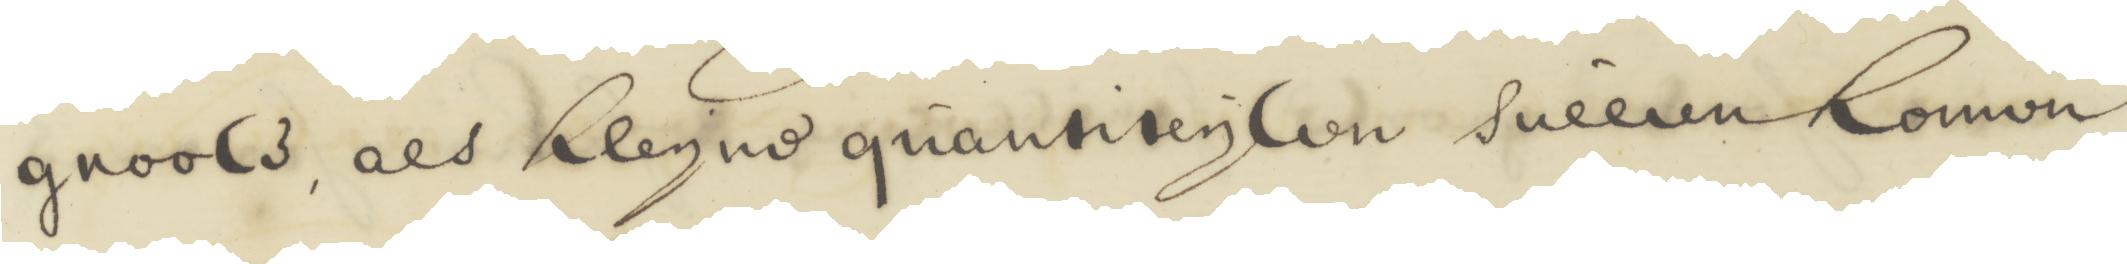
groote, als kleijne quantiteijten sullen komen
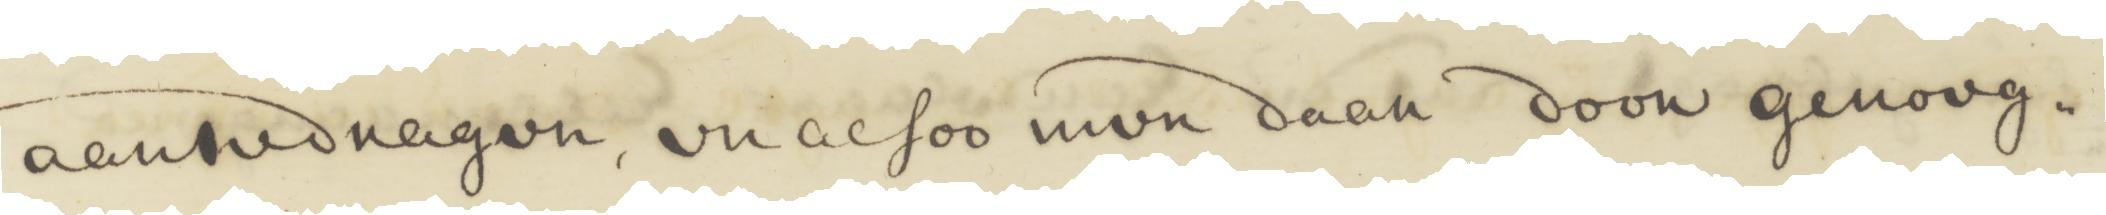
aantedragen, en alsoo men daar door genoeg„
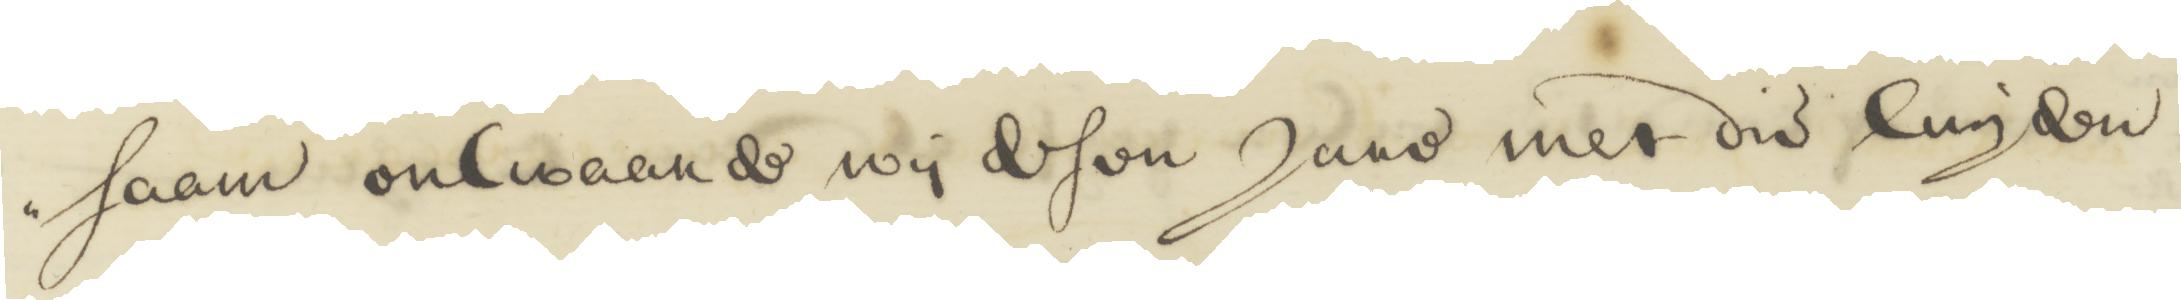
„saam ontwaarde wij desen Jare met die luijden
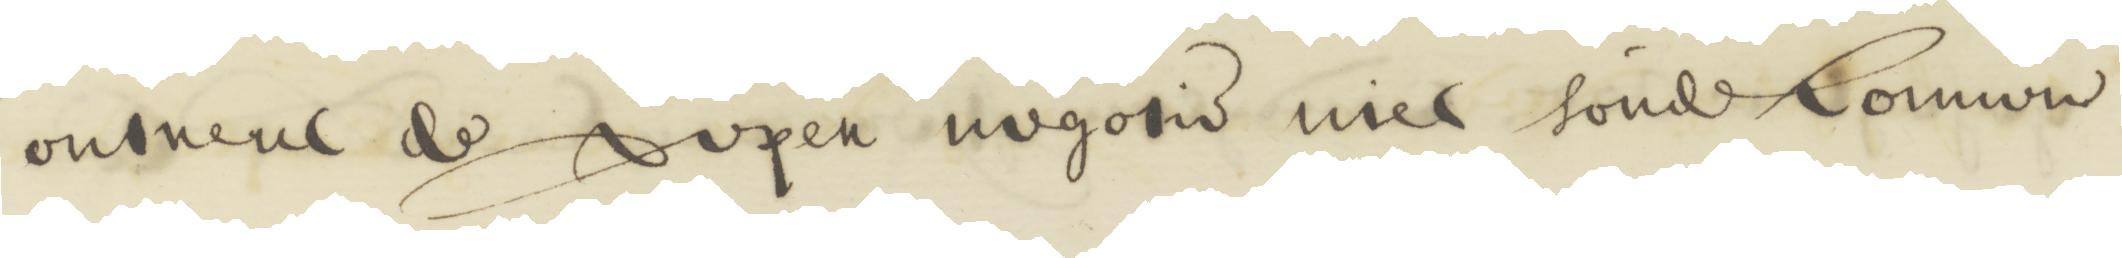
ontrent de peper negotie niet soude konnen
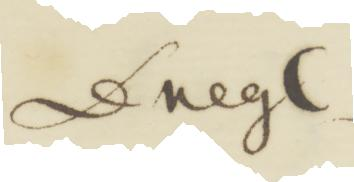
te regt
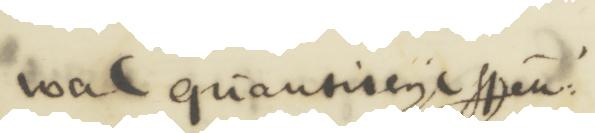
wat quantiteijt pper:
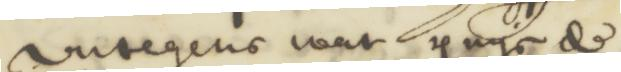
en tegens wat paijs de
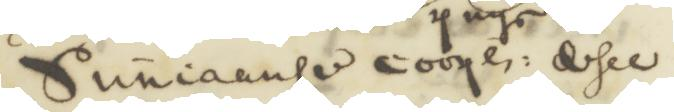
Suriaanse coopl: desel
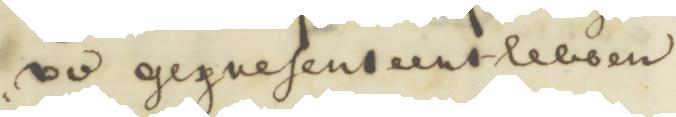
ve gepresenteert hebben
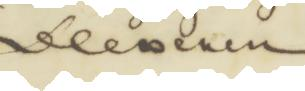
televeren
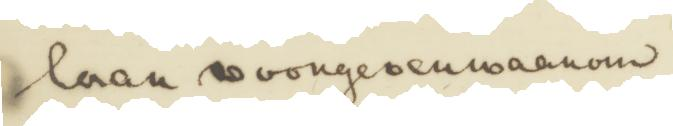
haar voorgeven waarom
